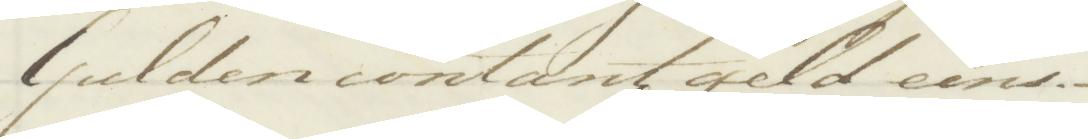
Gulden contant geld eens.
